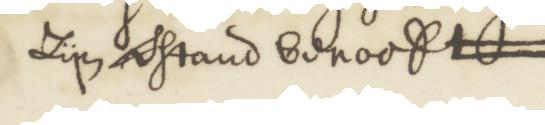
zijn verstand berooft
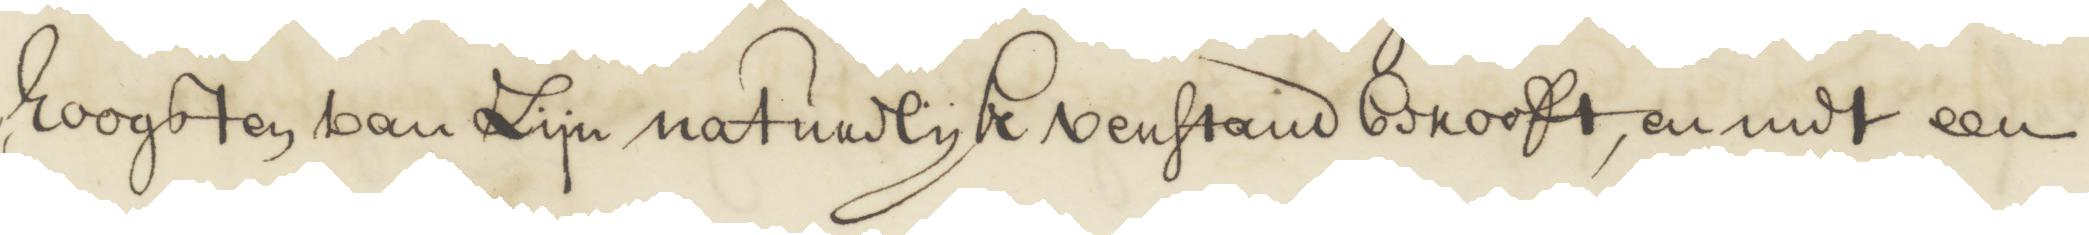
hoogsten van zijn naturelijk verstand berooft, en met een
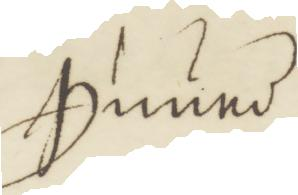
puure
